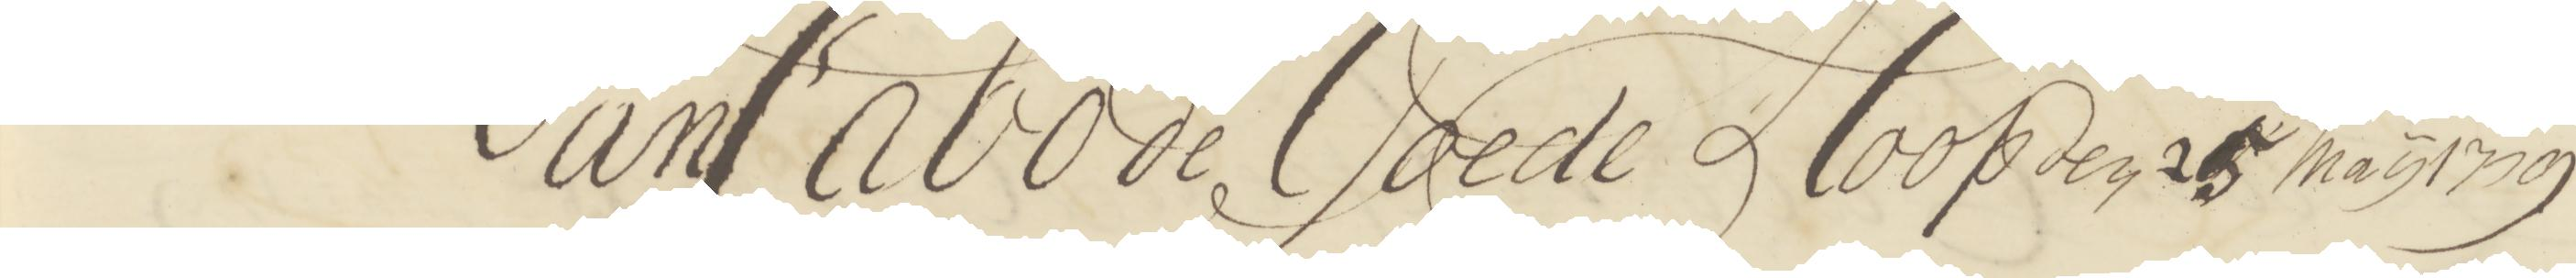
Van Cabo de Goede Hoop den 25 maij 1719
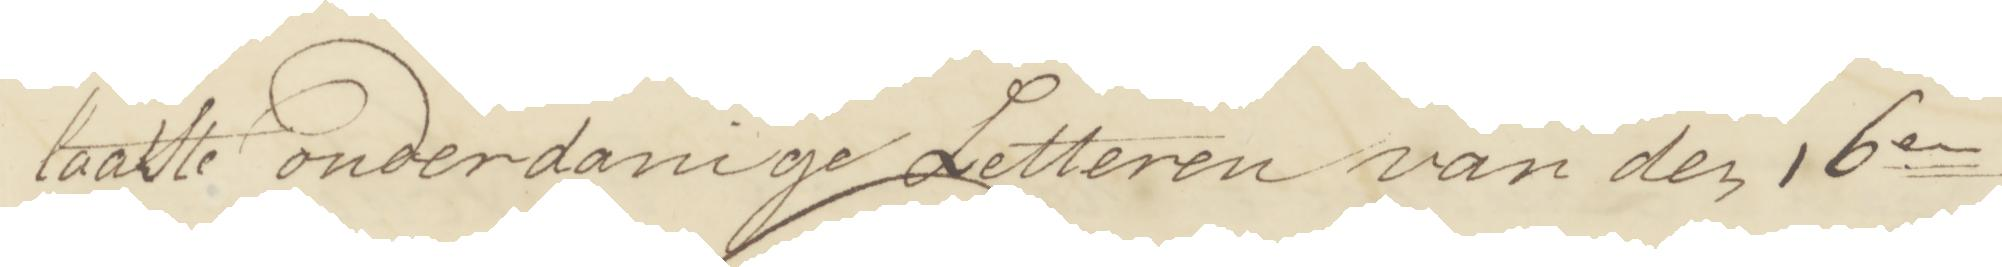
laatste onderdanige Letteren van den 16=en
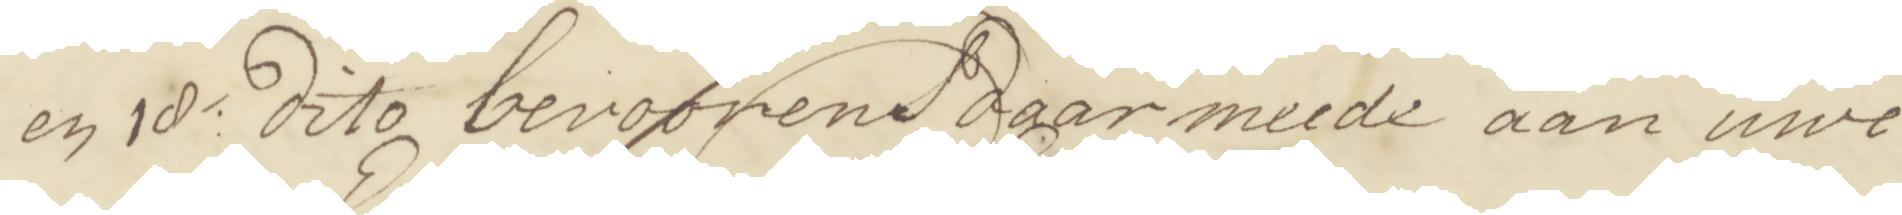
en 18:' dito bevoorens daar meede aan uwe
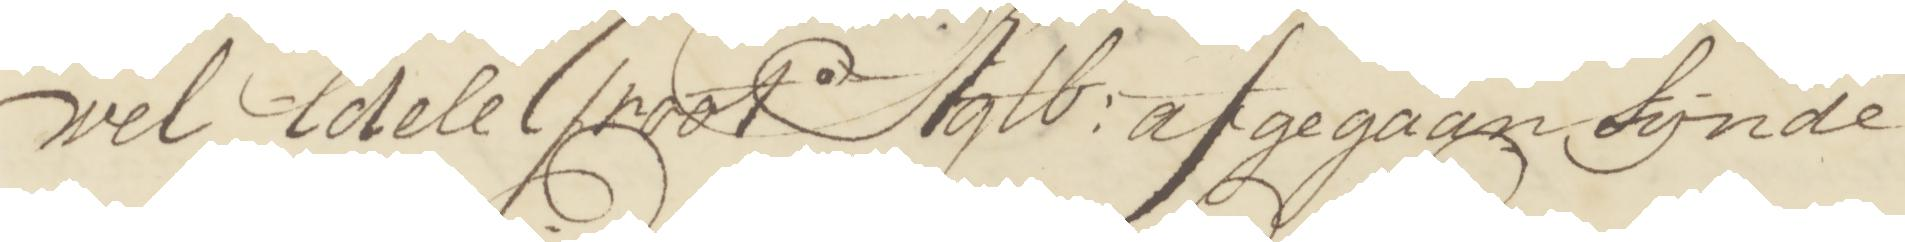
wel Edele Groot Agtb: afgegaan sijnde
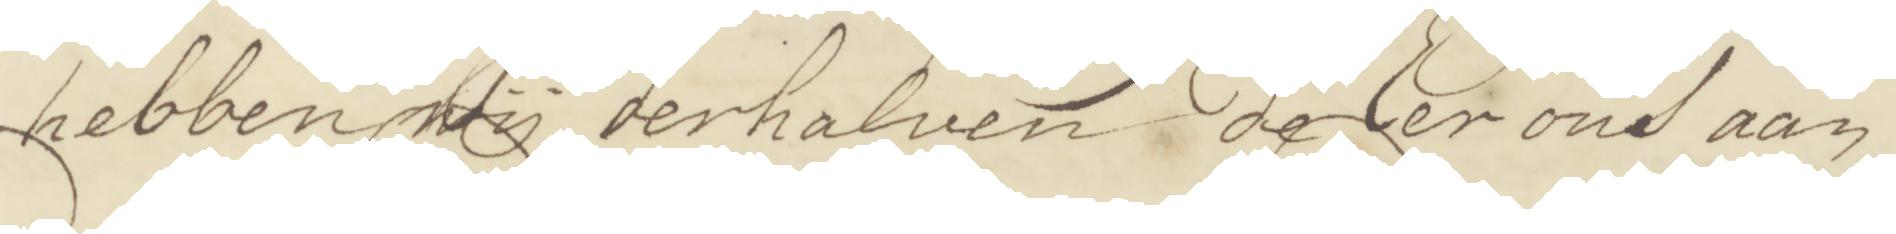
hebben wij derhalven de Eer ons aan
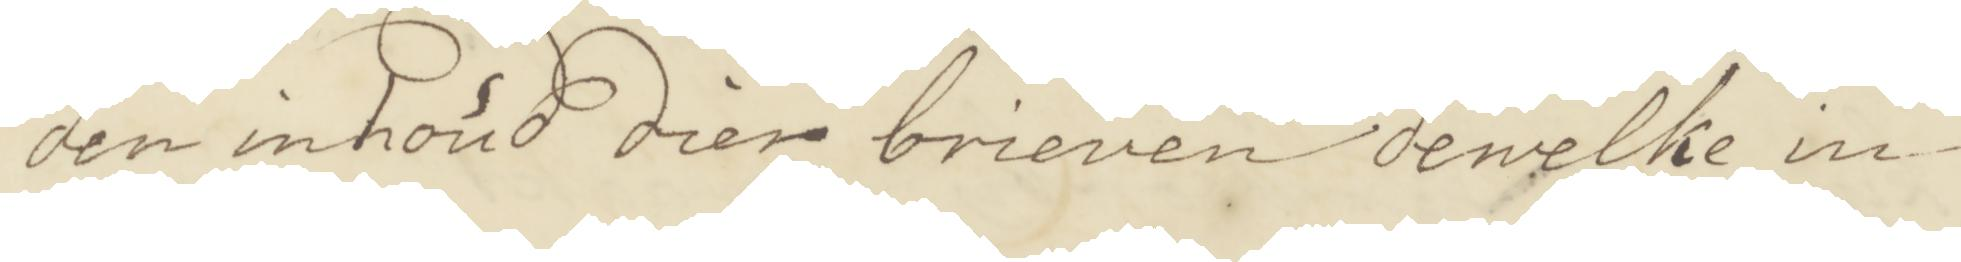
den inhoud dier brieven dewelke in
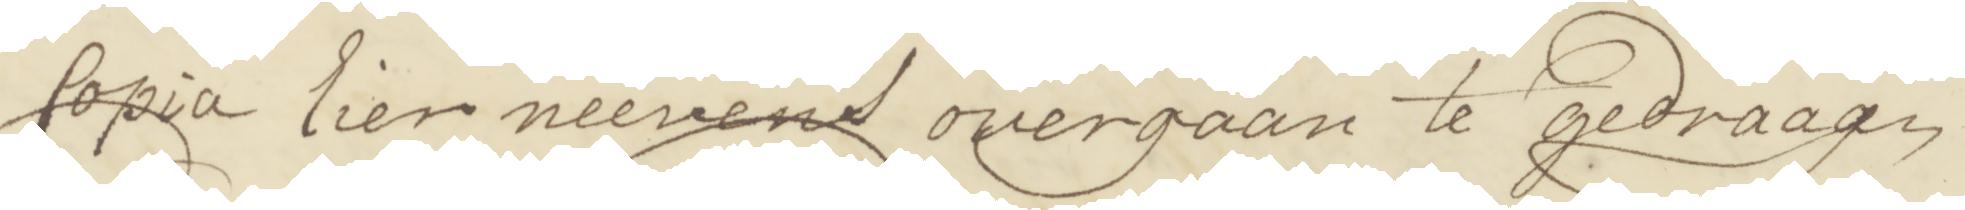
Copia hier neevens overgaan te gedraagen
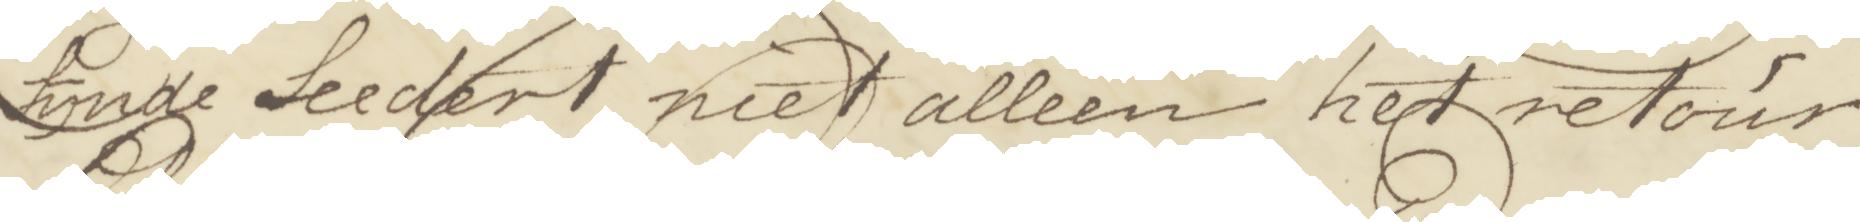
sijnde seedert niet alleen het retour
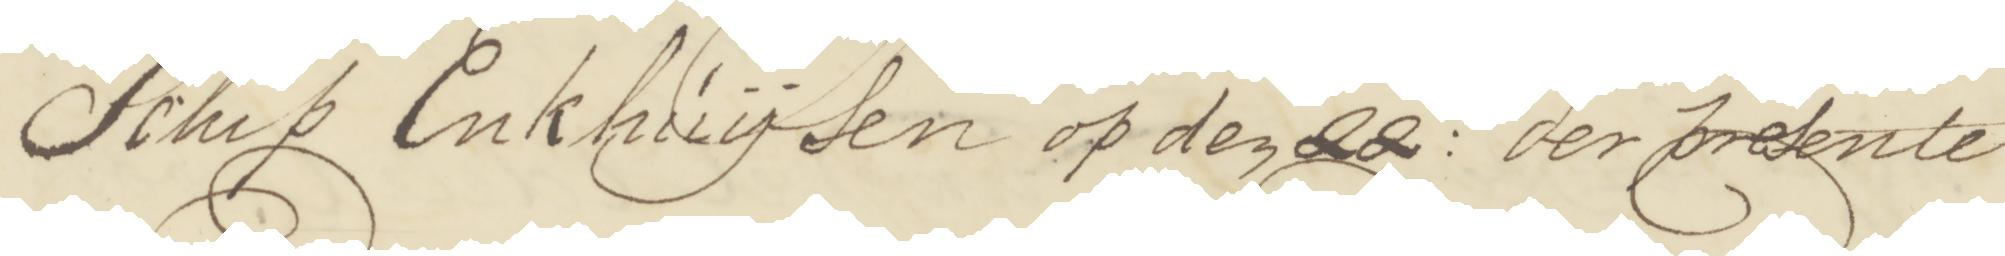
schip Enkhuijsen op den 22:' der presente
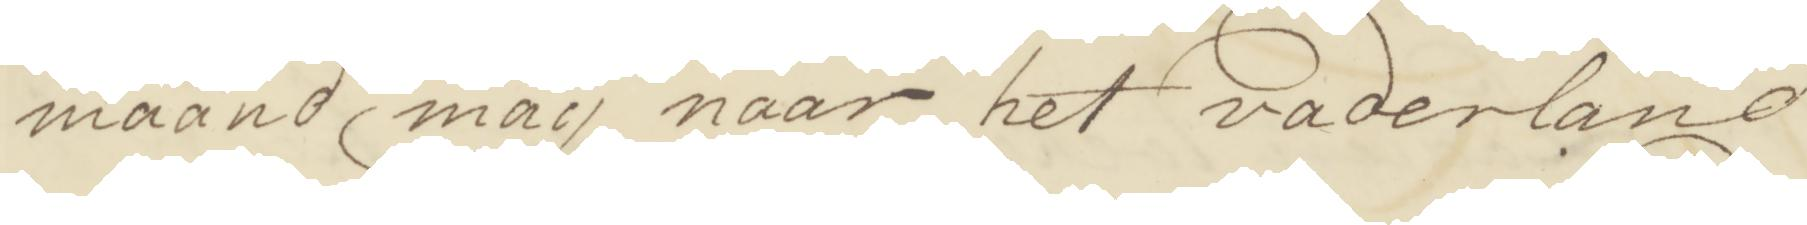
maand maij naar het vaderland
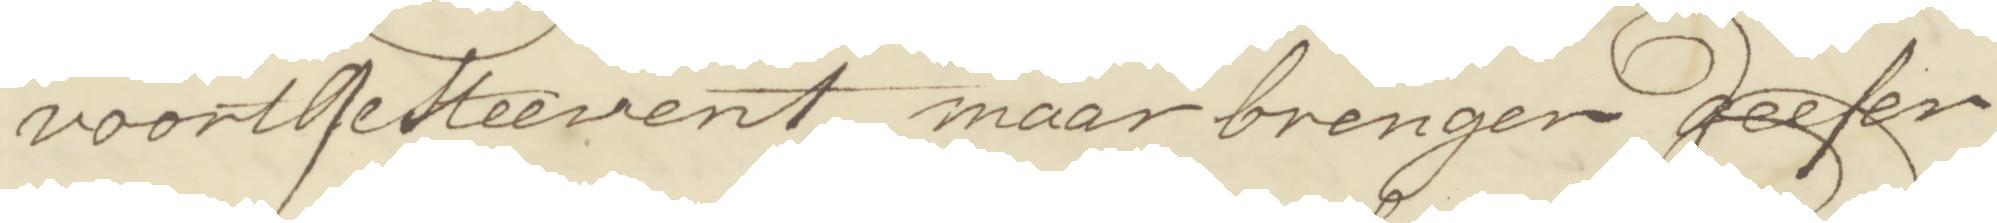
voort gesteevent maar brenger deeser
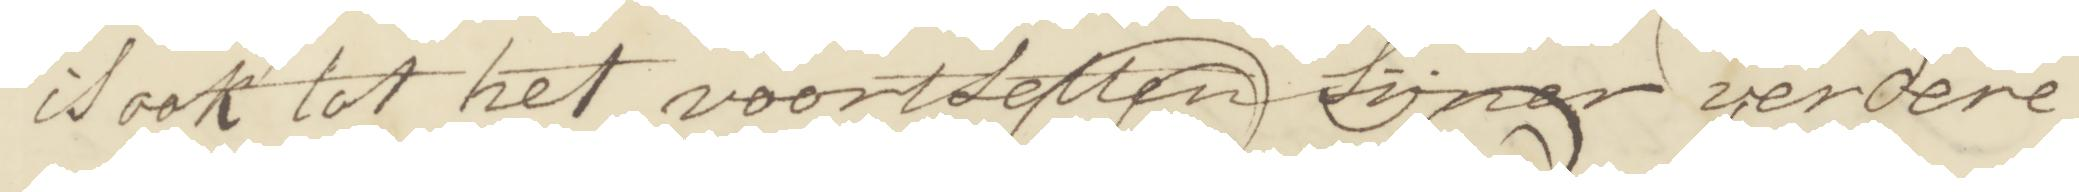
is ook tot het voortsetten sijner verdere
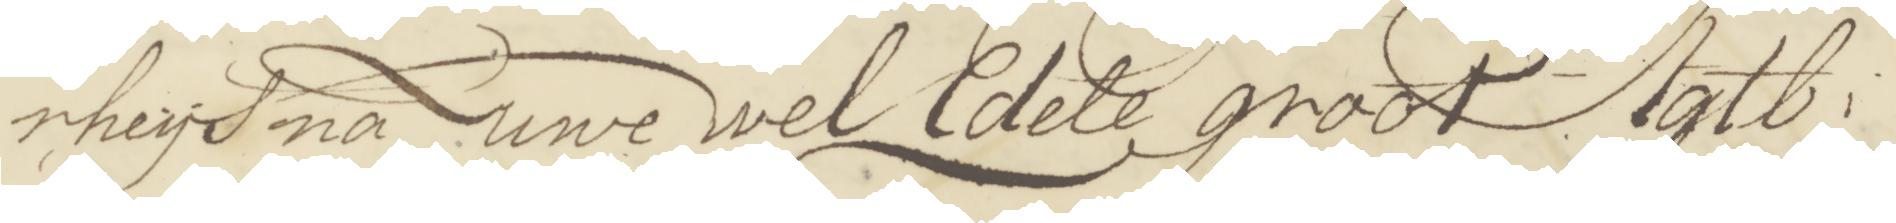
rheijs na uwe wel Edele groot Agtb:
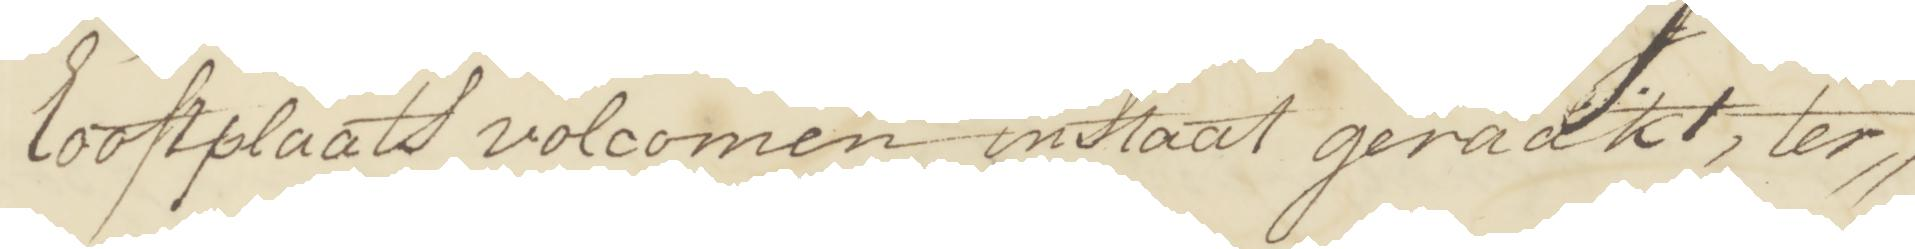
hooftplaats volcomen instaat geraakt, ter„
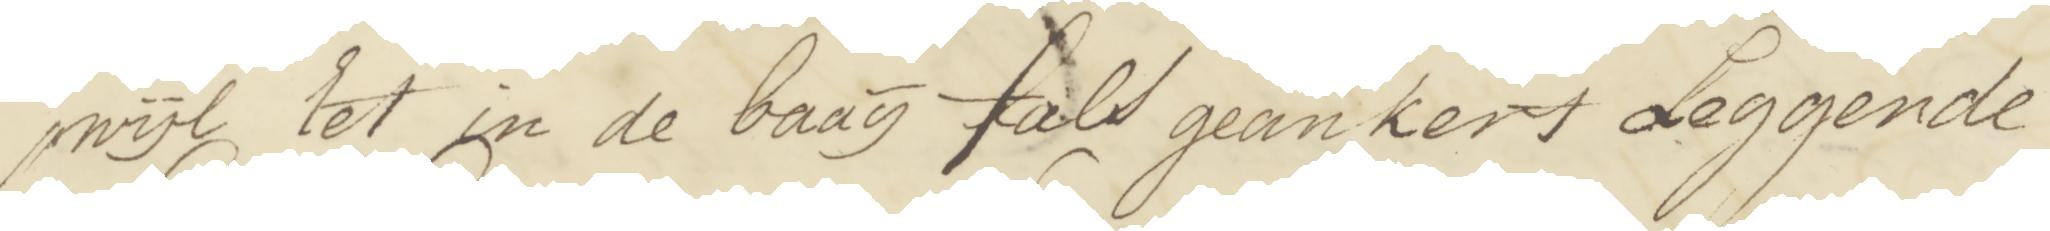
„wijl het in de baaij fals geankert Leggende
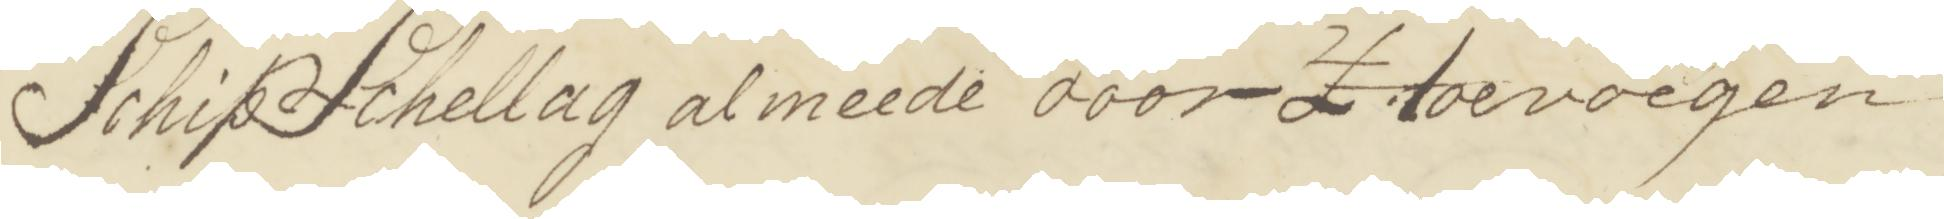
schip schellag al meede door 't toevoegen
